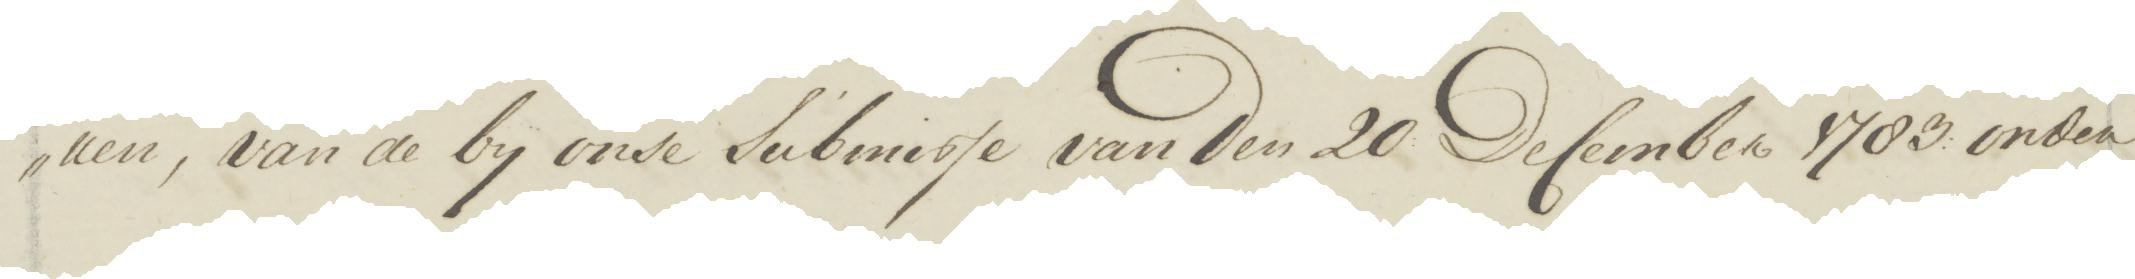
„ren, van de bij onse submisse van den 20: December 1783: onder
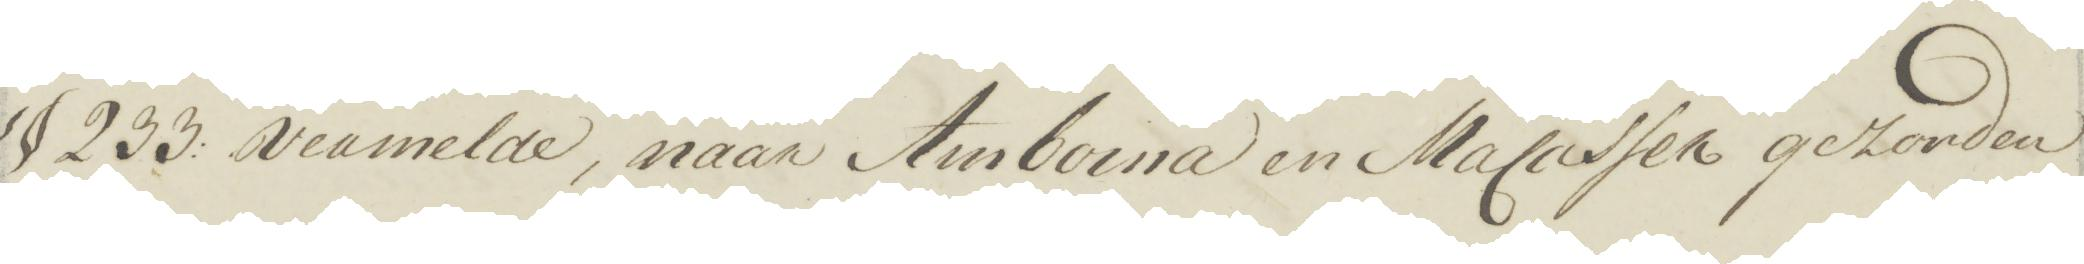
§ 233: vermelde, naar Amboina en Macasser gezonden
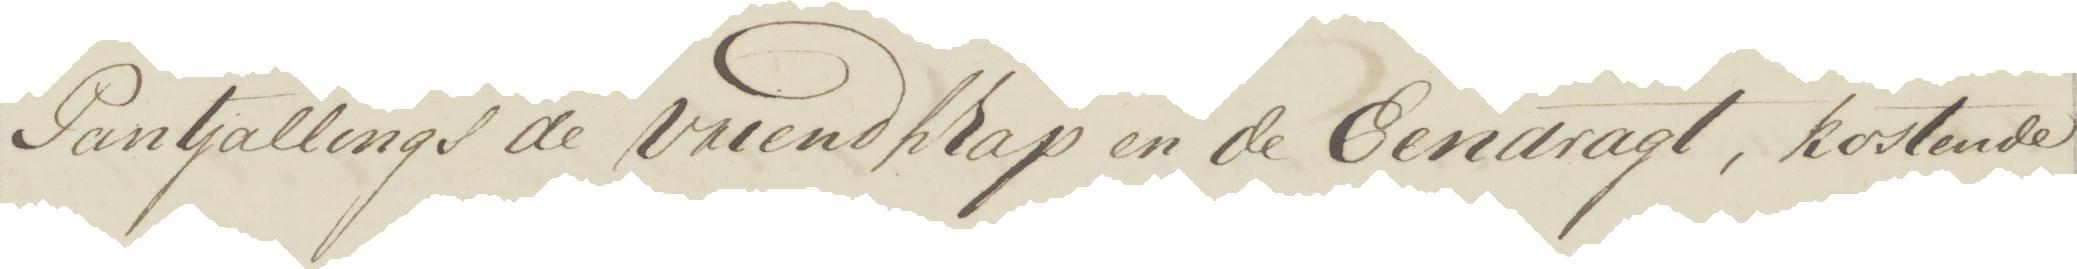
Pantjallings de vriendschap en de Eendragt, kostende
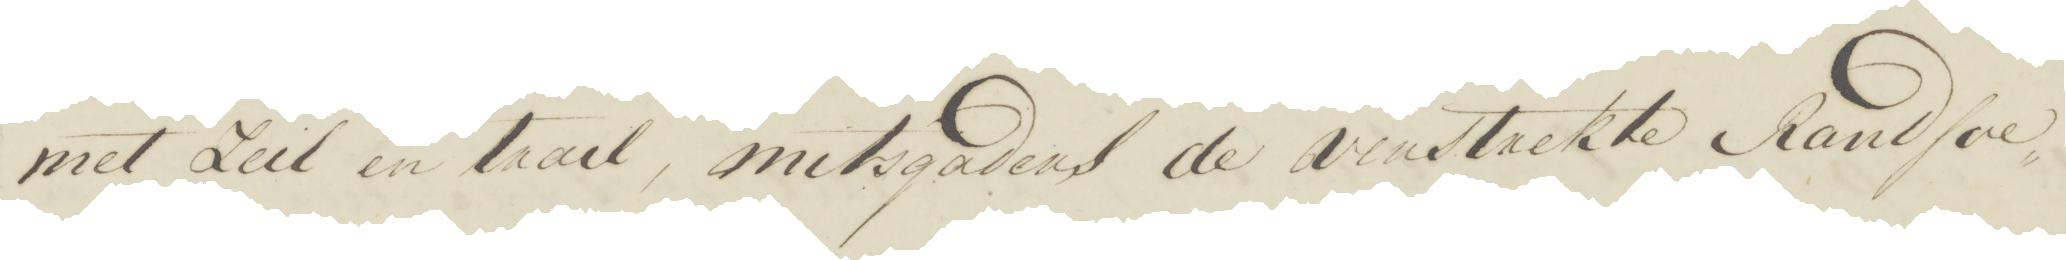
met zeil en trail, mitsgaders de verstrekte Randsoe„
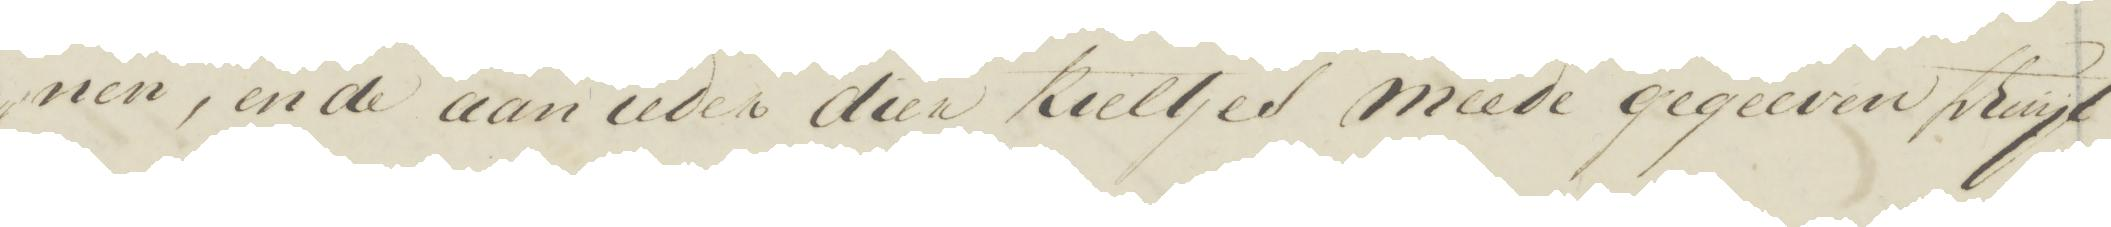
„nen, en de aan ieder dier kieltjes meede gegeeven schuijt
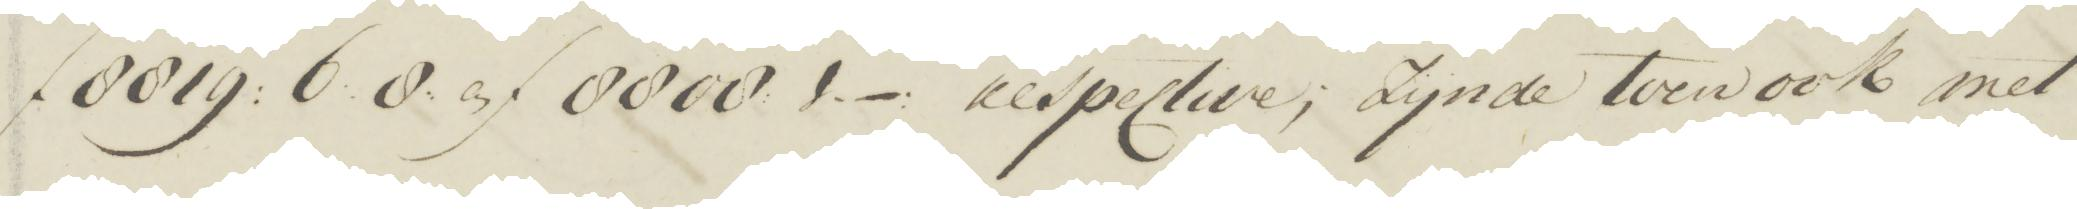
ƒ8819:6:8:3 en ƒ8808:1:—: respective; zijnde toen ook met
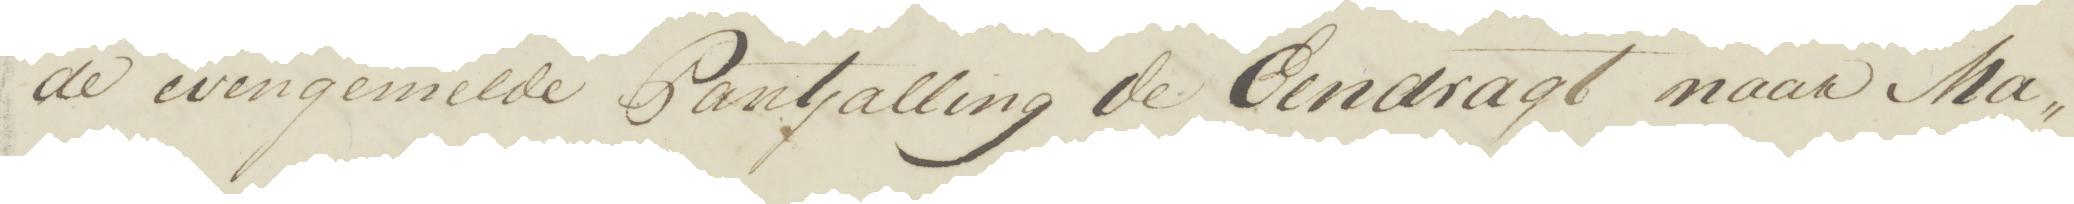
de evengemelde Pantjalling de Eendragt naar Ma„
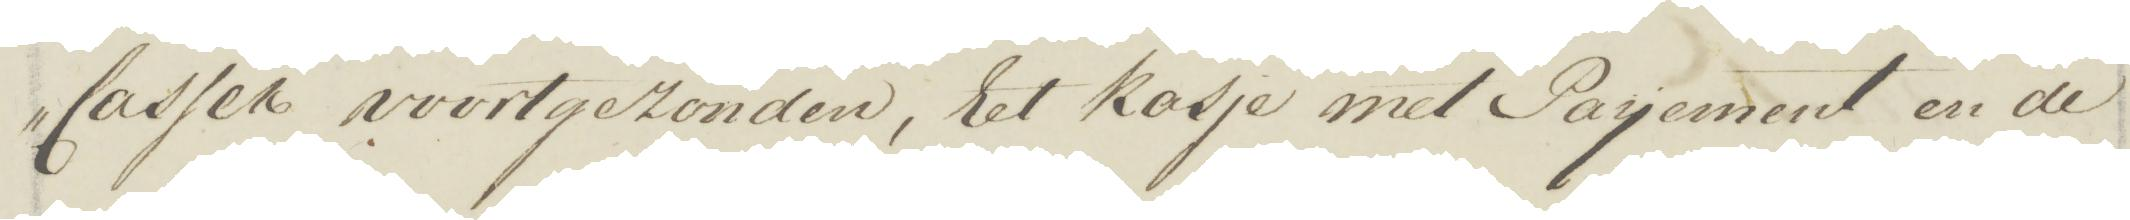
„casser voortgezonden, het kasje met Paijement en de
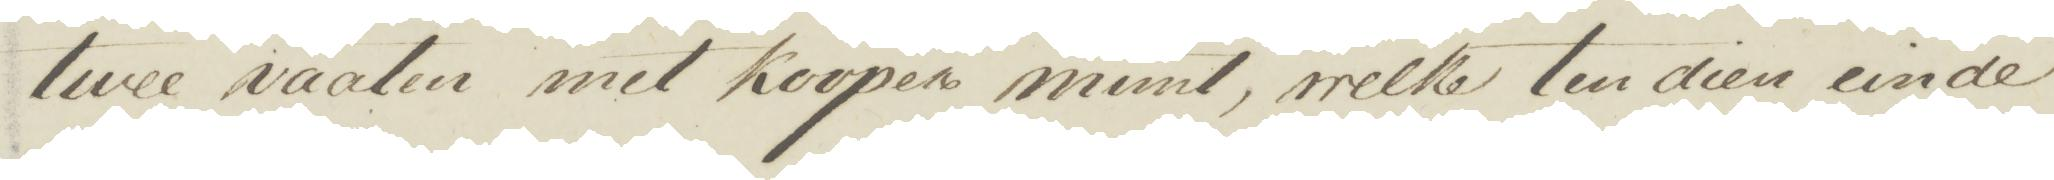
twee vaaten met kooper munt, welke ten dien einde
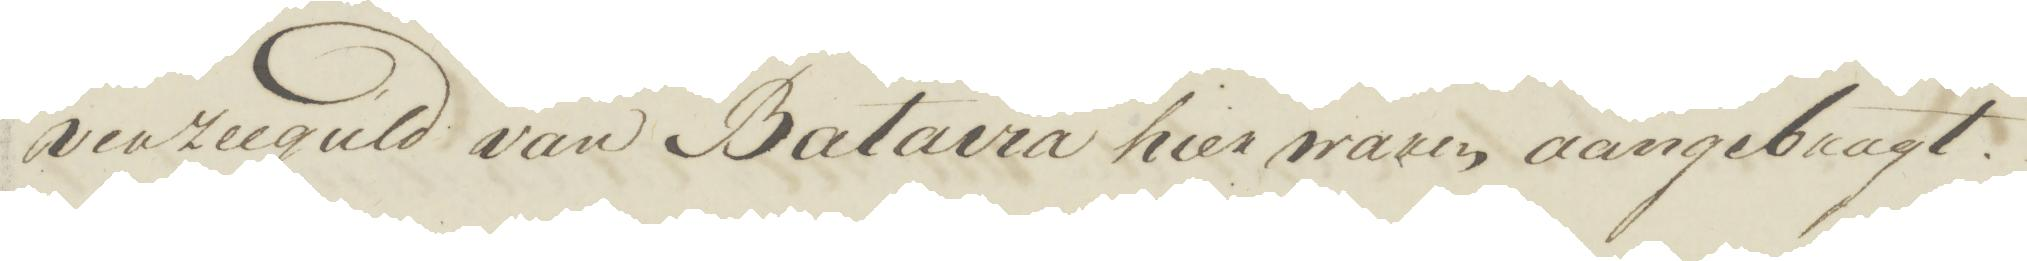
verzeeguld van Batavia hier waren aangebragt.
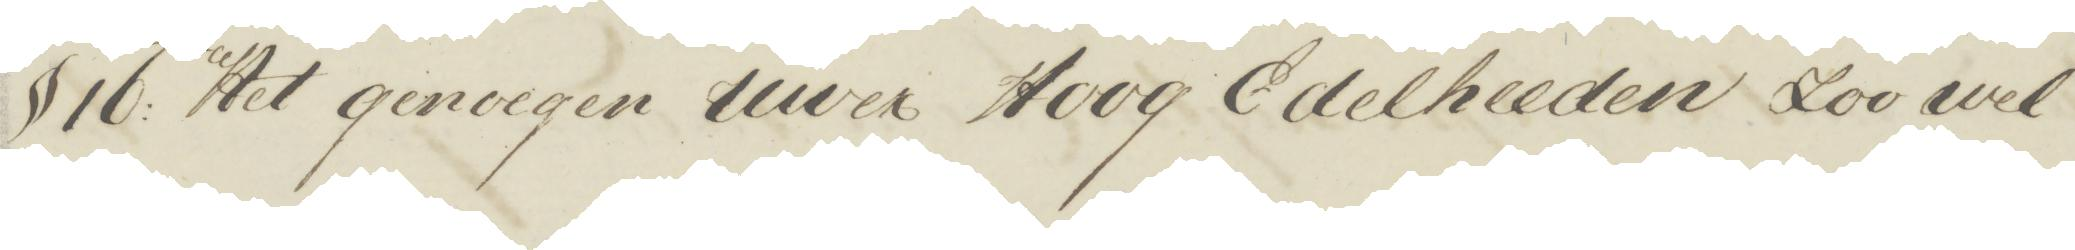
§ 16: Het genoegen uwer Hoog Edelheeden zoo wel
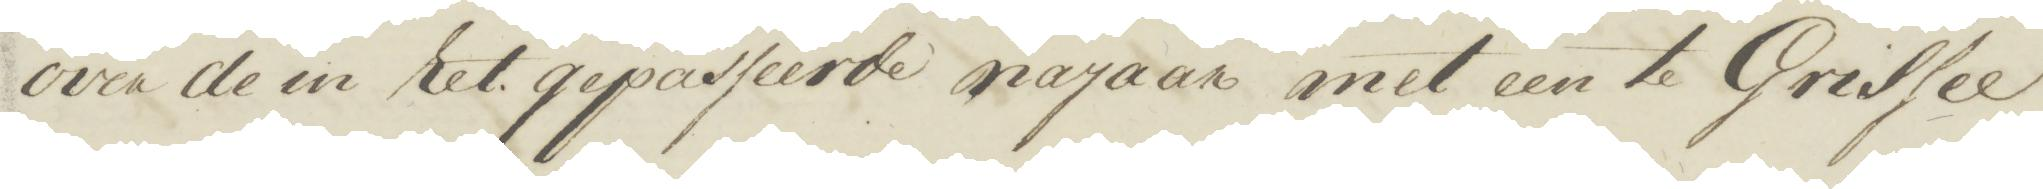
over de in het gepasseerde najaar met een te Grissee
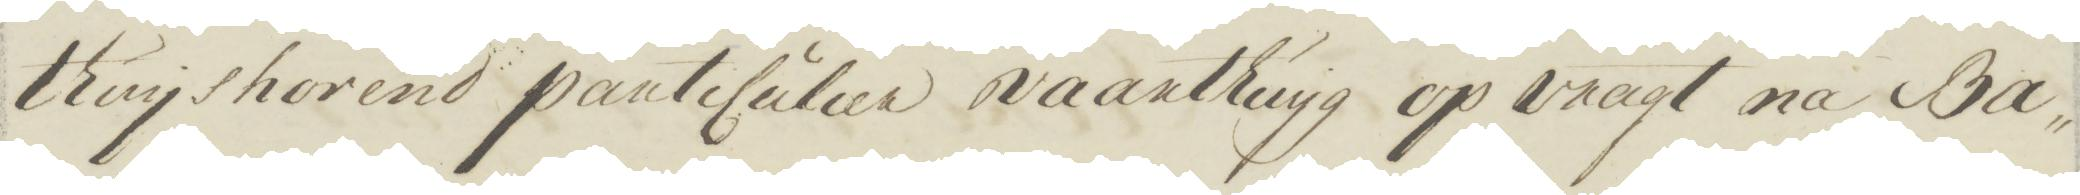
thuijshorend particulier vaarthuijg op vragt na Ba„
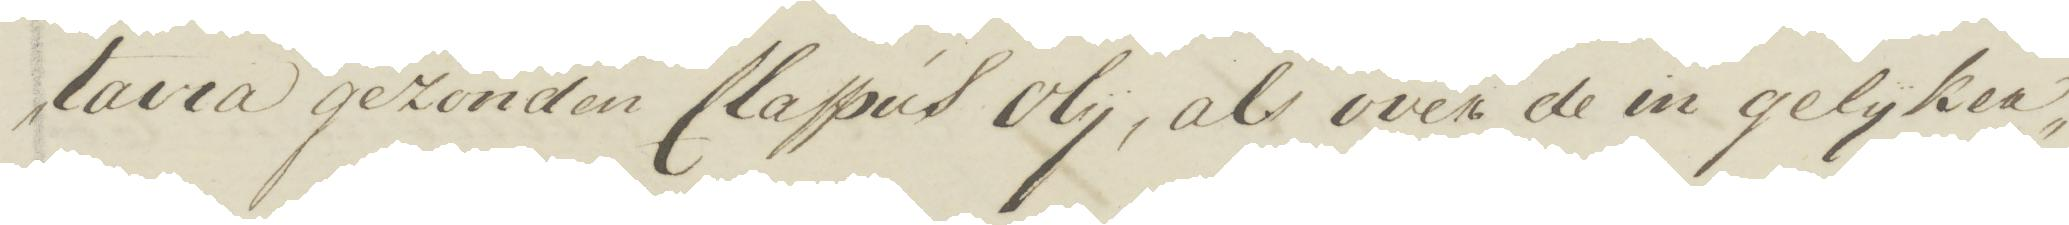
„tavia gezonden Clappus olij, als over de in gelijker„
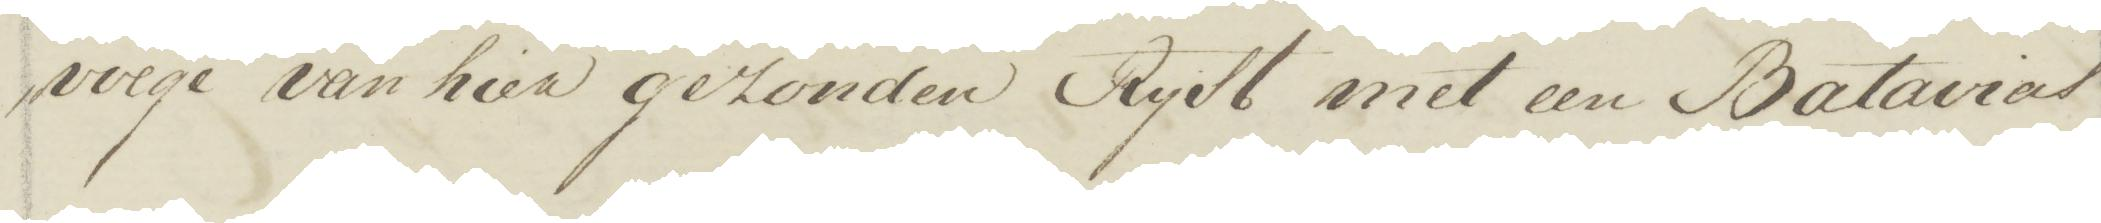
„voege van hier gezonden Rijst met een Batavias
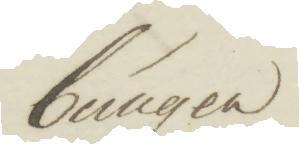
burger
